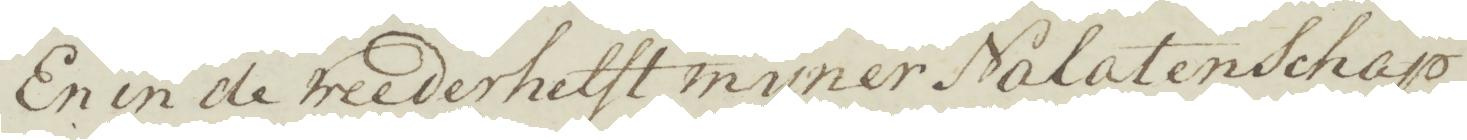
En in de weederhelft myner Nalatenschap,
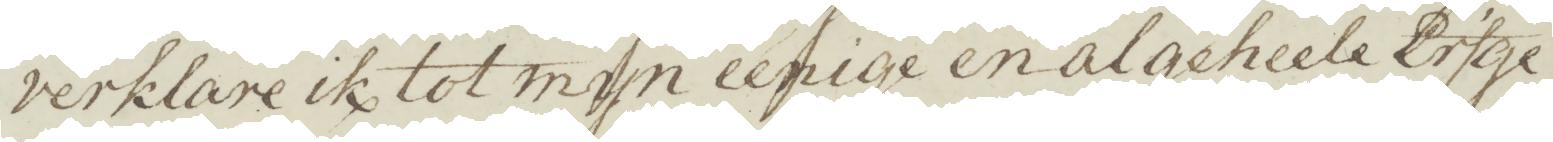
verklare ik tot myn eenige en algeheele Erfge
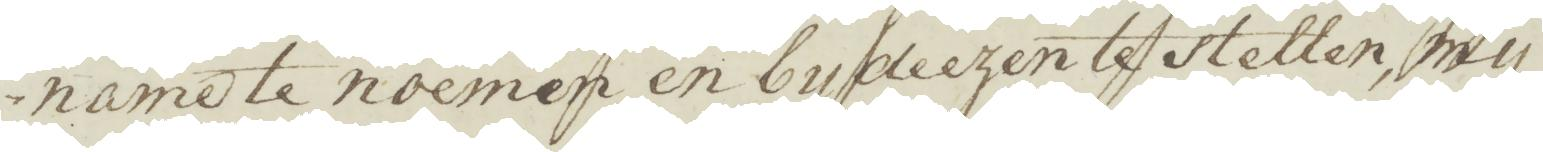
„name te noemen en by deezen te stellen, my
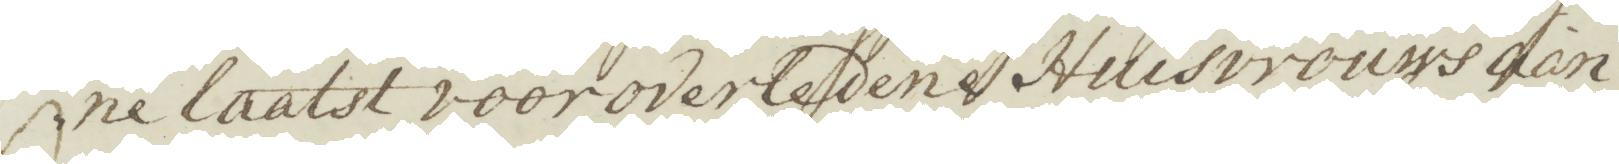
ne laatst vooroverledene Huisvrouws aan
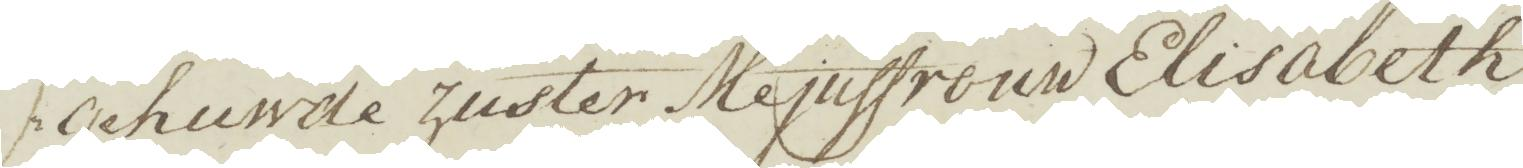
gehuwde zuster Mejuffrouw Elisabeth
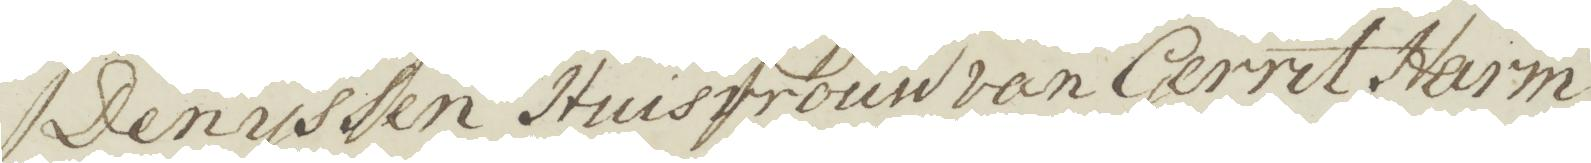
Denyssen Huisvrouw van Gerrit Harm
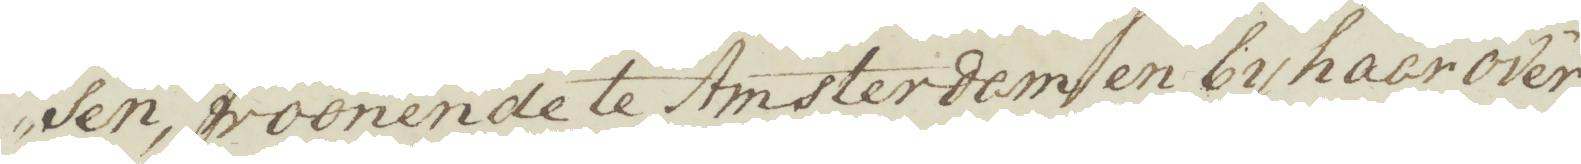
„sen, woonende te Amsterdam en by haar over,
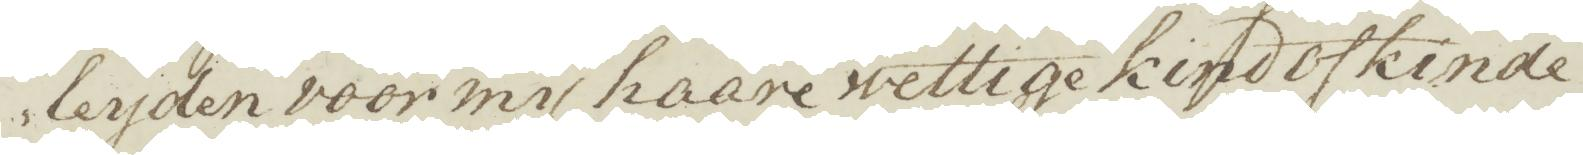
„leyden voor my, haare wettige kind of kinde
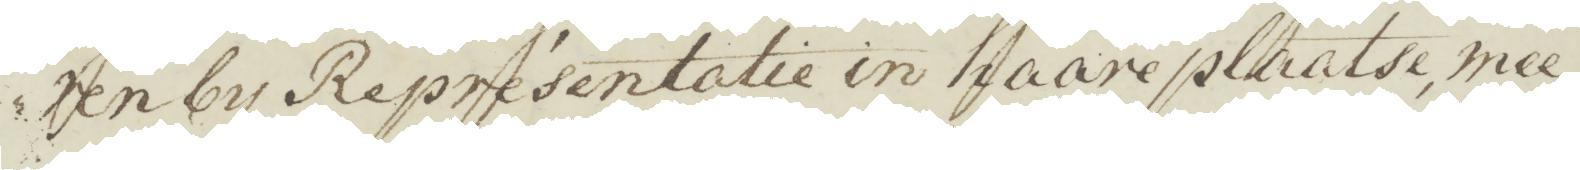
„ren by Representatie in haare plaatse, mee
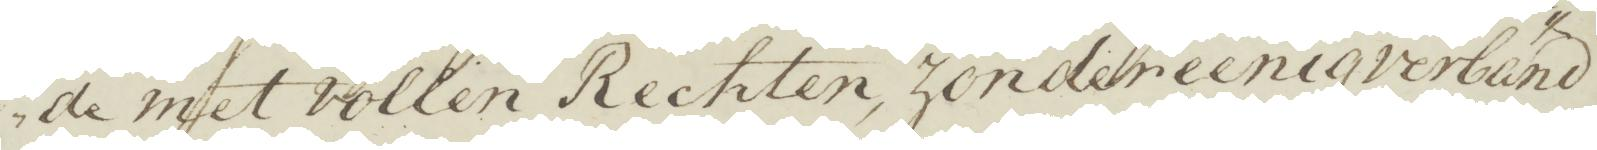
„de met vollen Rechten, zonder eenig verband
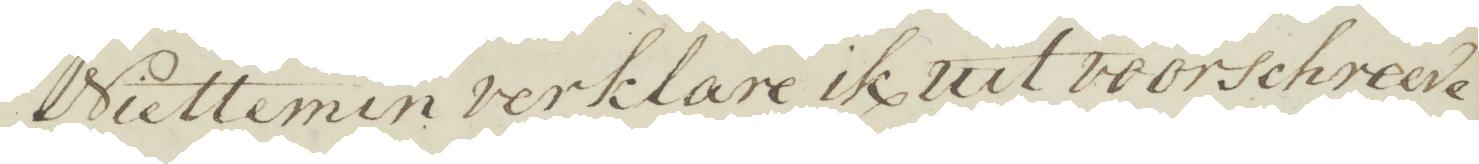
Niettemin verklare ik uit voorschreeve
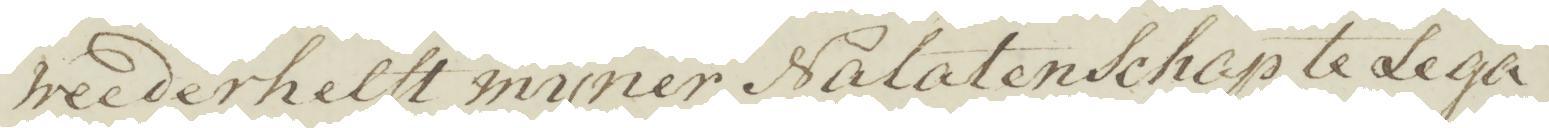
weederhelft myner Nalatenschap te lega
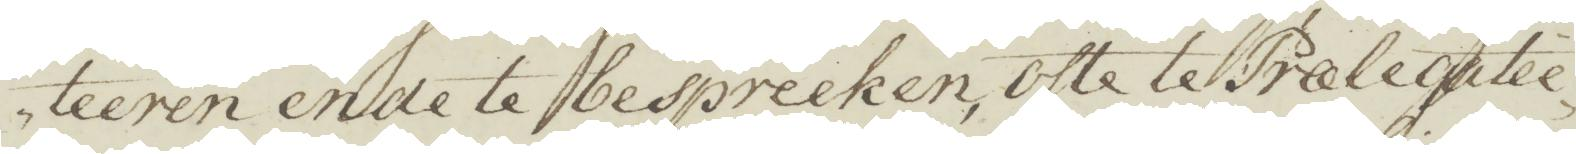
„teeren, ende te bespreeken, ofte te Praelegatee„
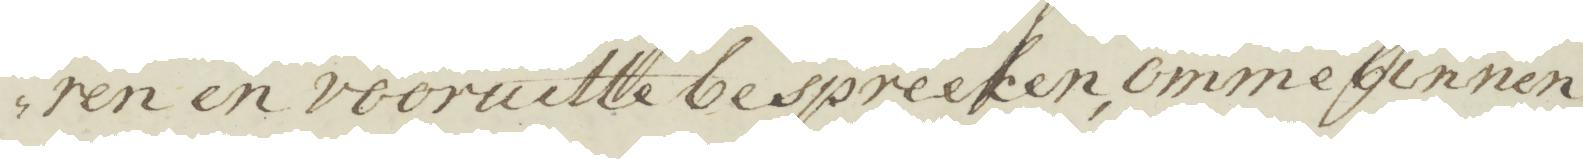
„ren en vooruitte bespreeken, omme binnen
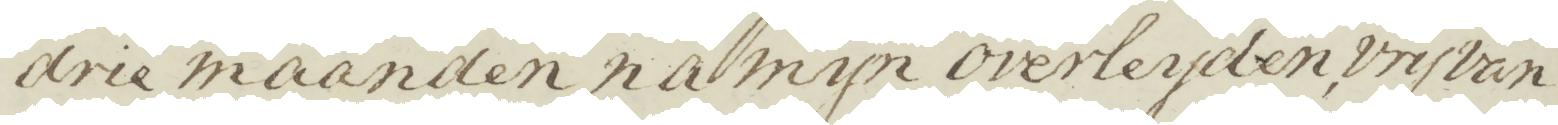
drie maanden na myn overleyden, vrij van
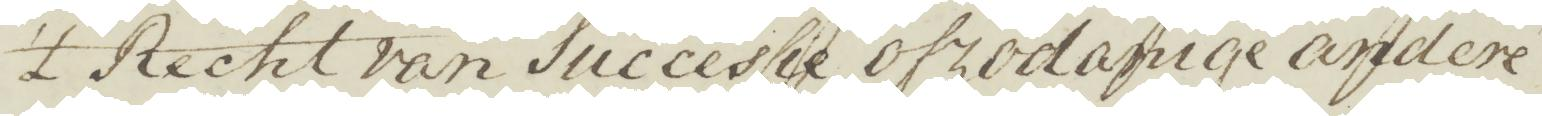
't Recht van Successie, of zodanige andere
